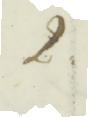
„ 2„
